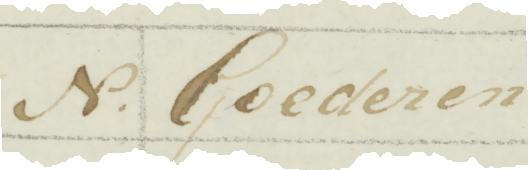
N. Goederen
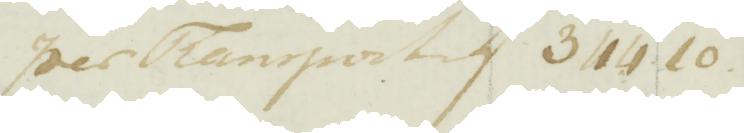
per Transport ƒ 344.10.
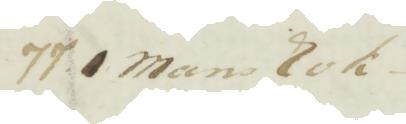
77.1 mans rok
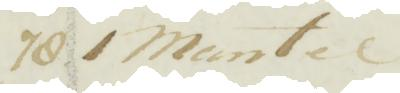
78. 1 mantel
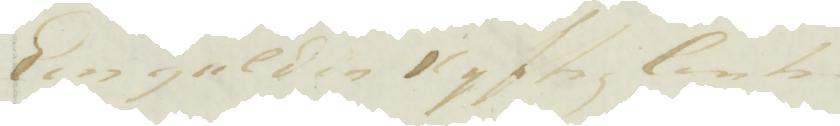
Een gulden vyftig Cents
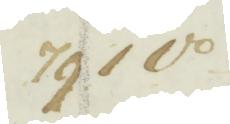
79 1 d.o
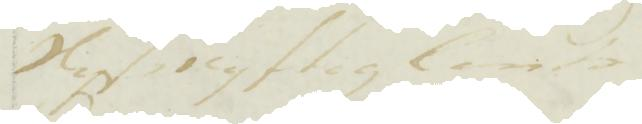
Vijf envijftig Cents
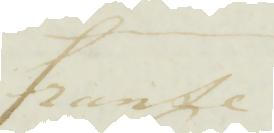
franse
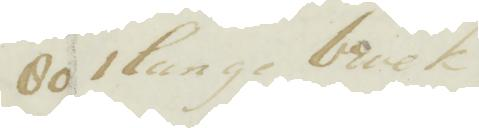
80 1 lange broek
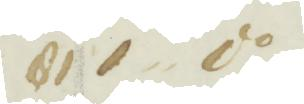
81 1 „ do
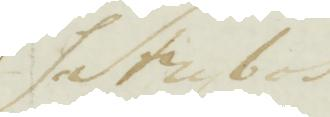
Ja strybos
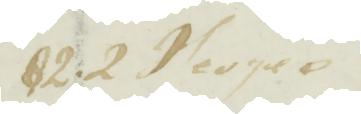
82. 2 Vesjes
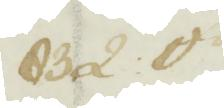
83.2:do
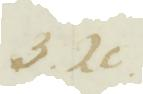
3.20.
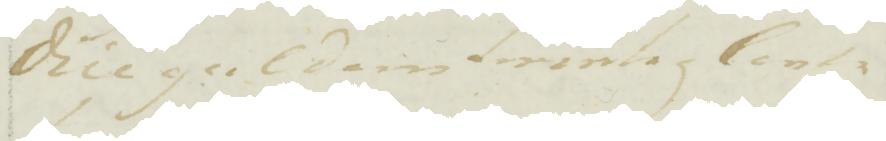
drie guldens twintig Cents
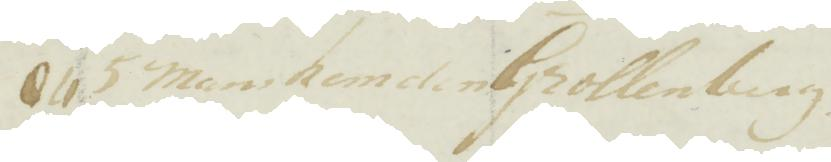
84. 5 manshemden Grollenberg
